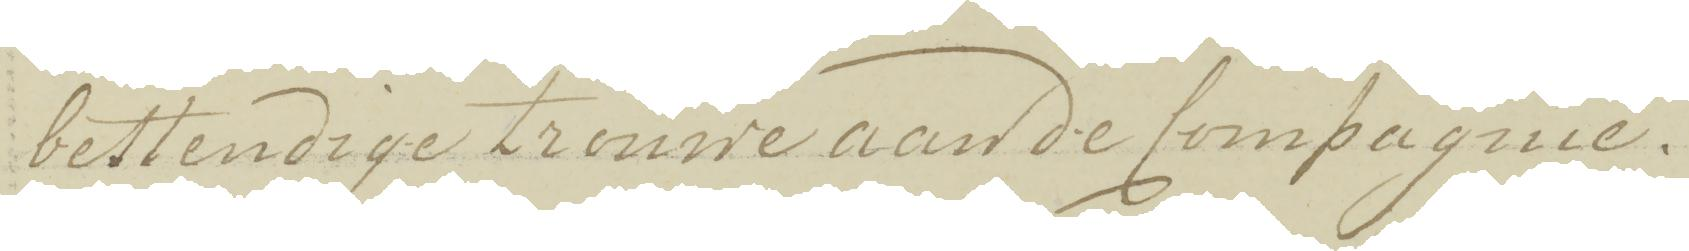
bestendige trouwe aan de Compagnie.
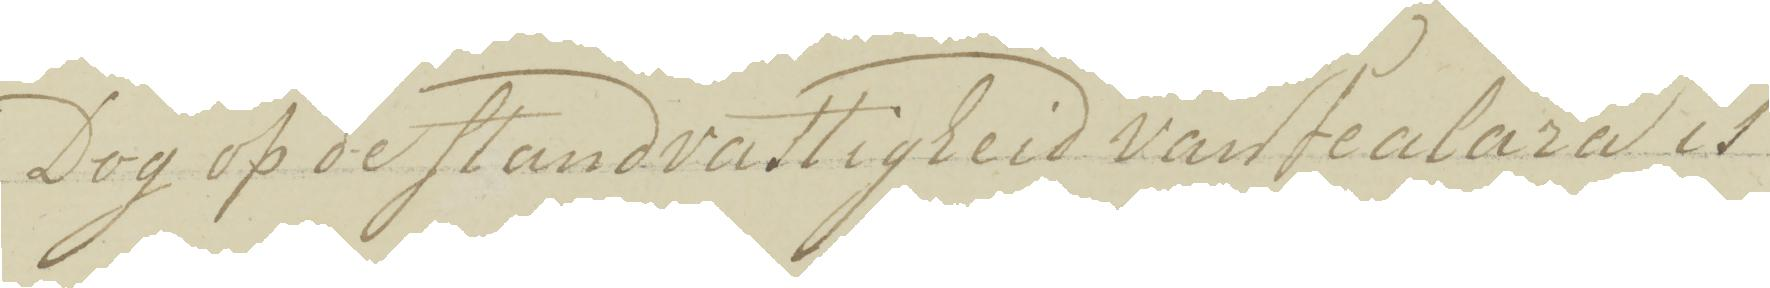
Dog op de standvastigheid van Fealara is
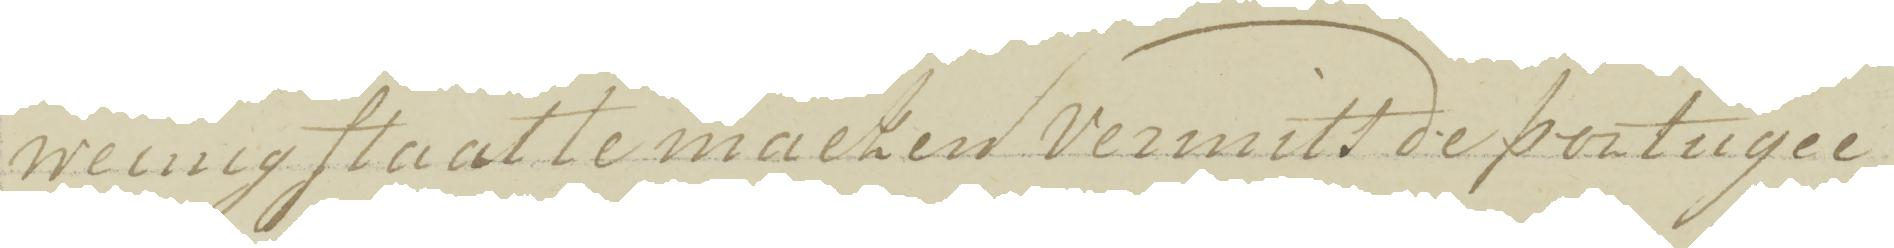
weinig staat te maeken vermits de portugee„
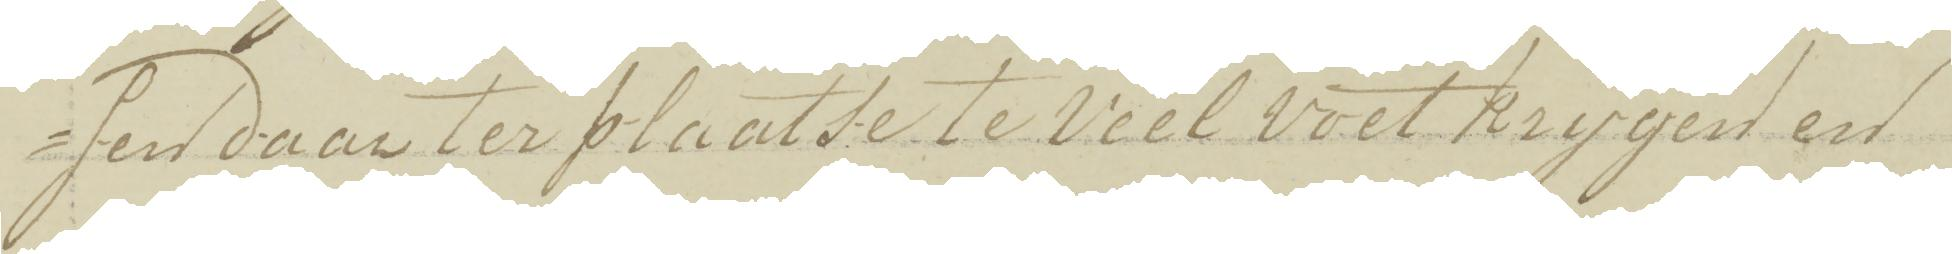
=sen daar ter plaatse te veel voet krijgen en
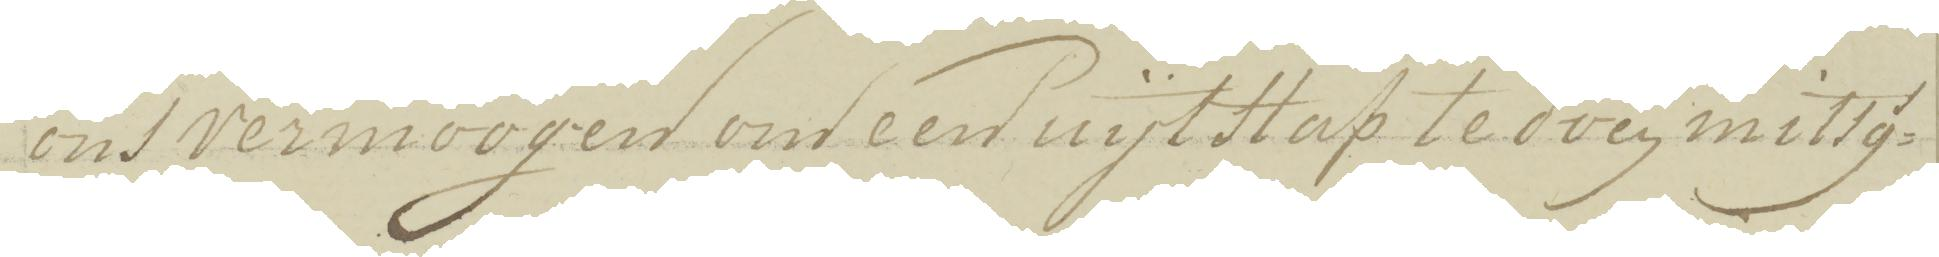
ons vermoogen om een uijtstap te doen mitsg=s
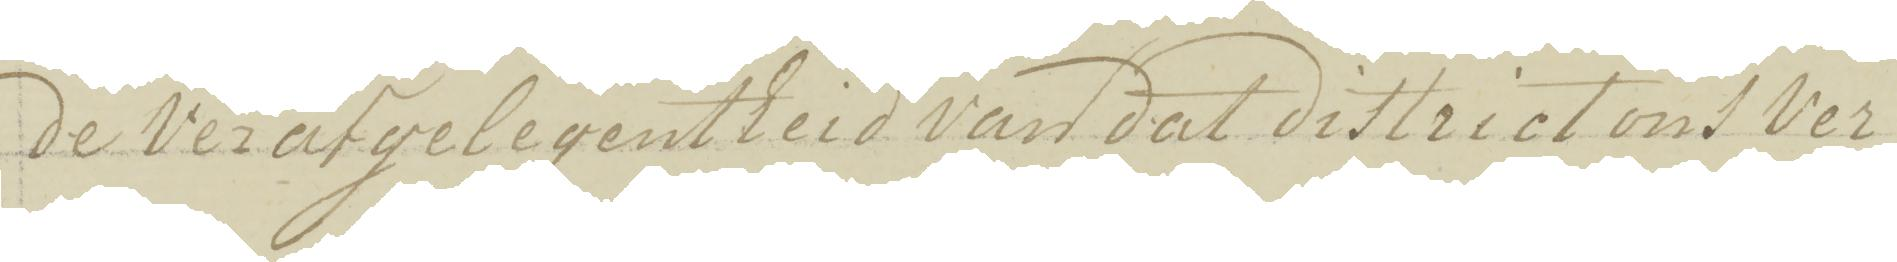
de verafgelegentheid van dat district ons ver
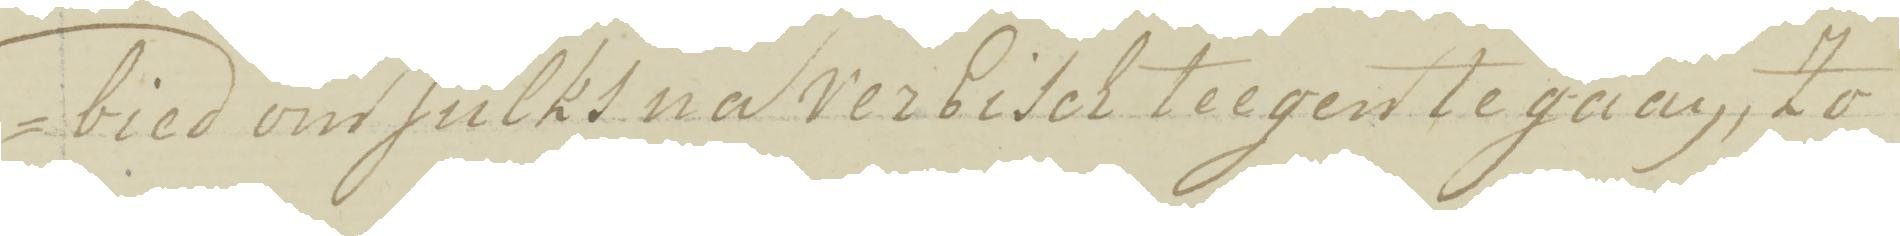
= bied om sulks na verEisch teegen te gaan, zo
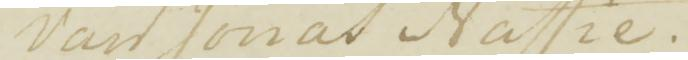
van Jonas Naffie.
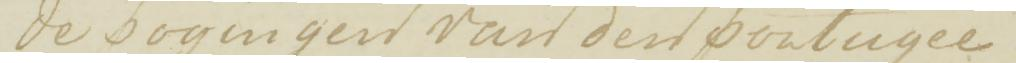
de pogingen van den portugee
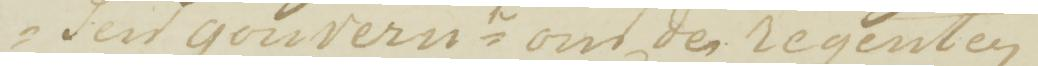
=sen gouvern=r ons de regenten
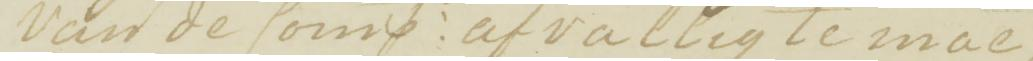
van de Comp: afvallig te mae
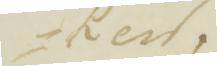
=ken,
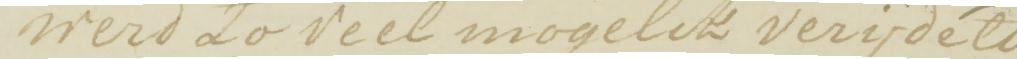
werd zo veel mogelik verijdelt
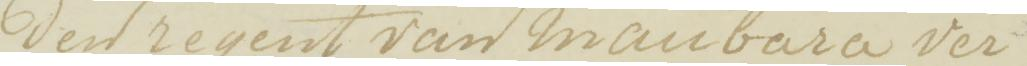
den regent van maubara ver
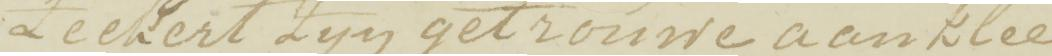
zeekert zijn getrouwe aan klee
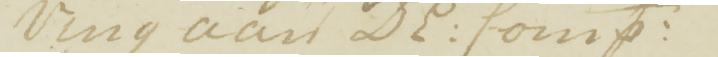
ving aan DE: Comp:
